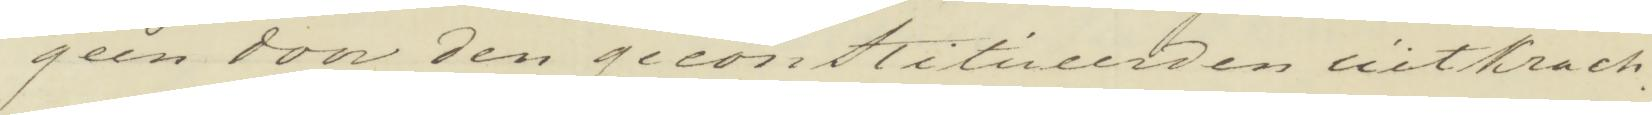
geen door den geconstitueerden uitkrach
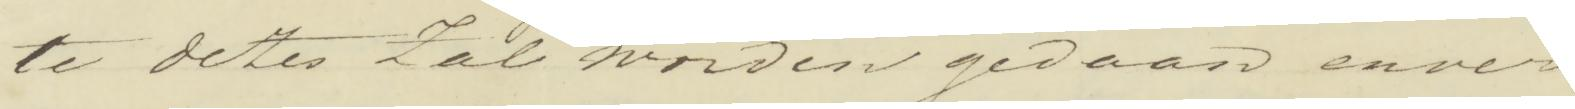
te deZes Zal worden gedaan en ver
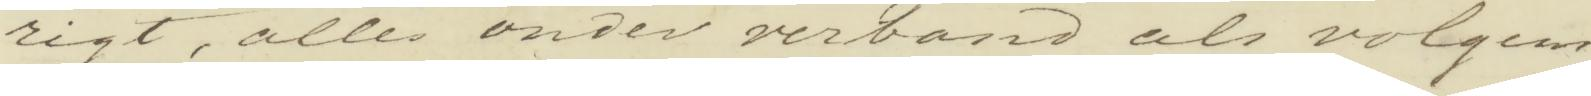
rigt, alles onder verband als volgens
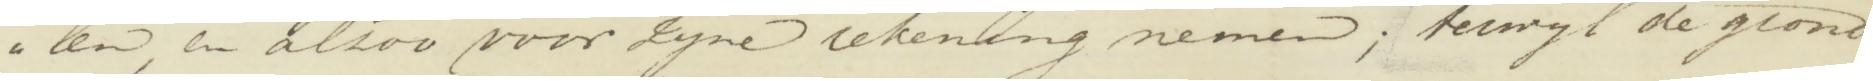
„len en alzoo voor zyne rekening nemen; terwyl de grond
